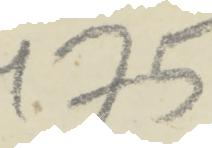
475
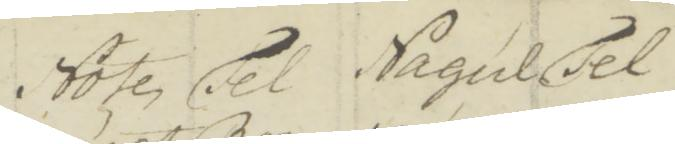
Noten Tel Nagul Tel
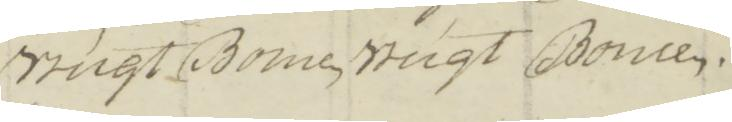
vrugt Bomen vrugt Bomen.
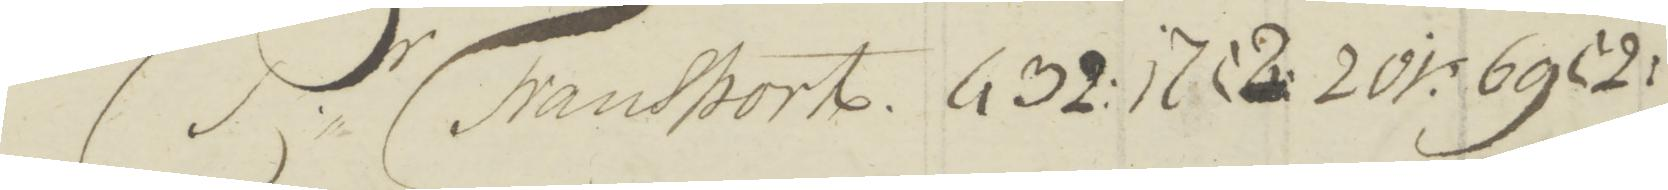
P„r Transport. 432: 1752: 201: 6952:
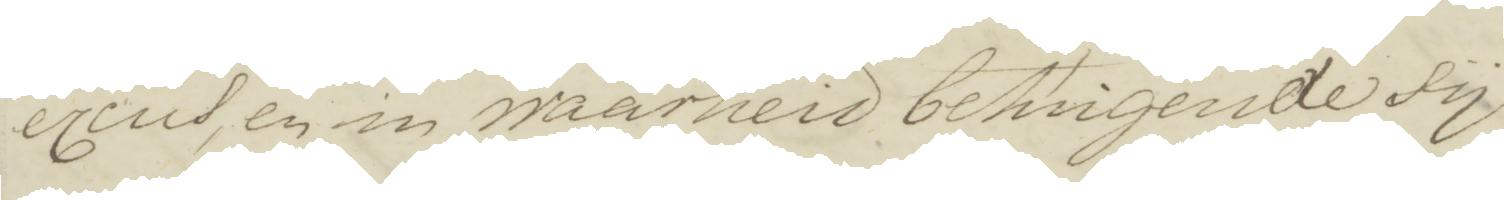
excus, en in waarheid betuigende sij
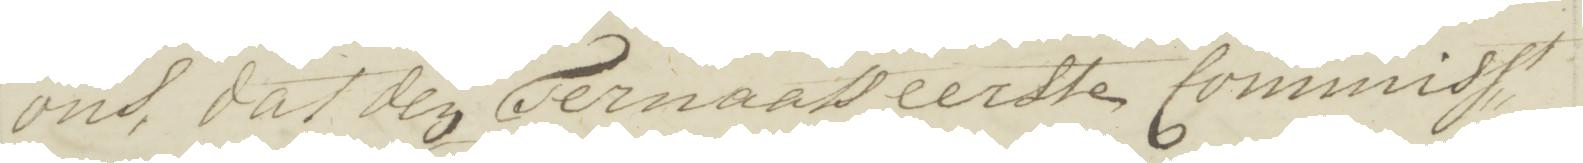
ons, dat den Ternaats eerste Commiss„t
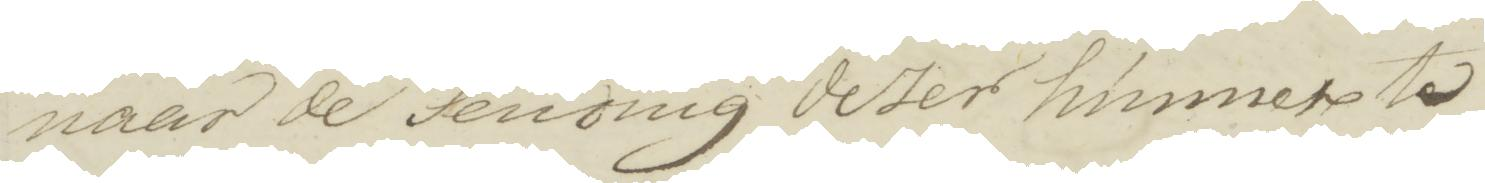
naar de sending dezer hunner te
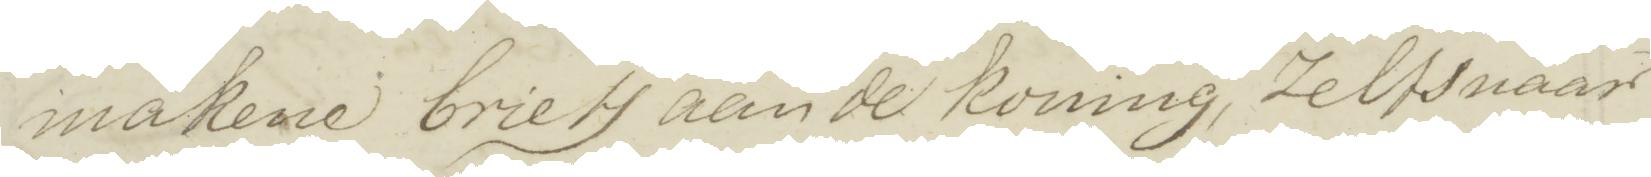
makene brieff aan de koning, zelfsnaar
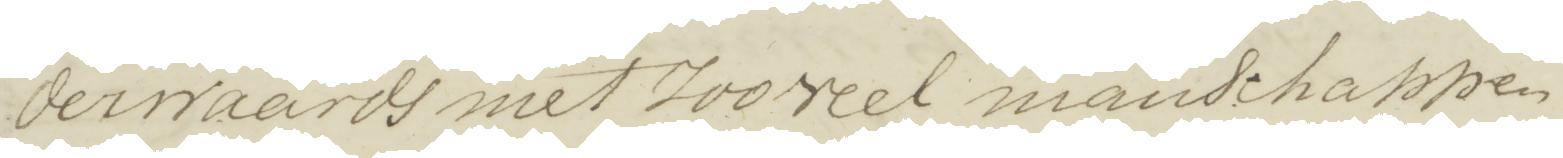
derwaards met zoo veel manschappen
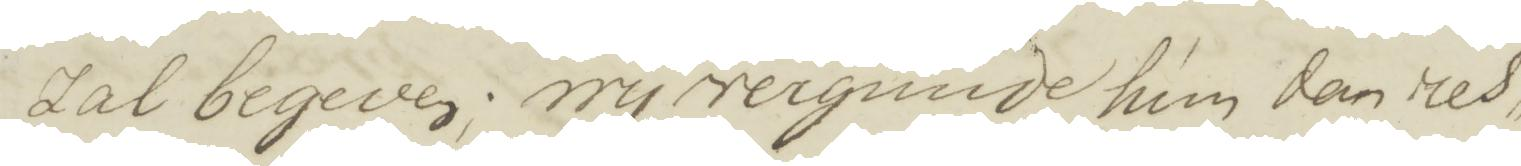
zal begeven; wij vergunde hun dan res„
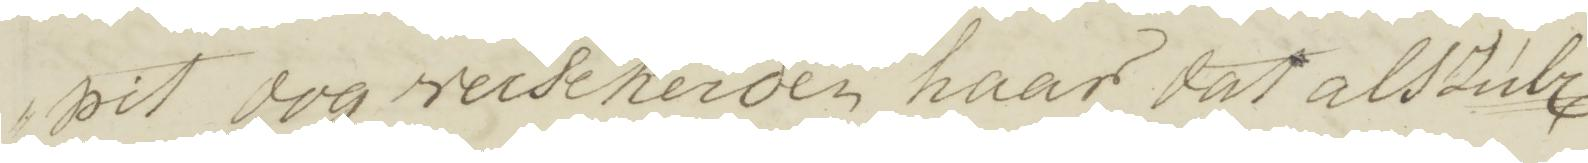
„pit dog versekerden haar dat als zulx
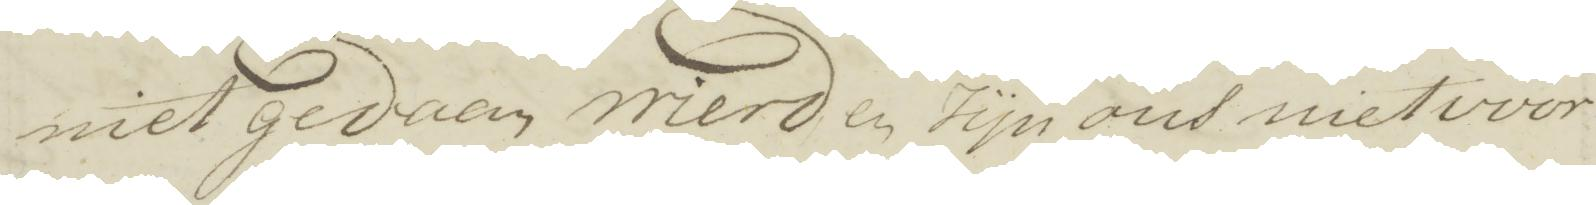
niet gedaan wierd en zijn ons niet voor
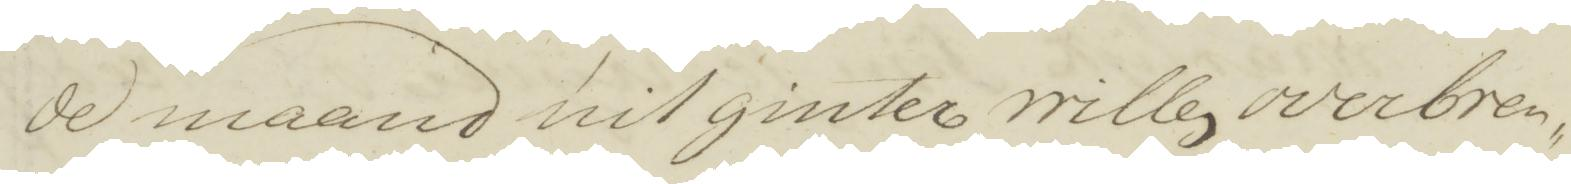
de maand uit ginter willen overbren„
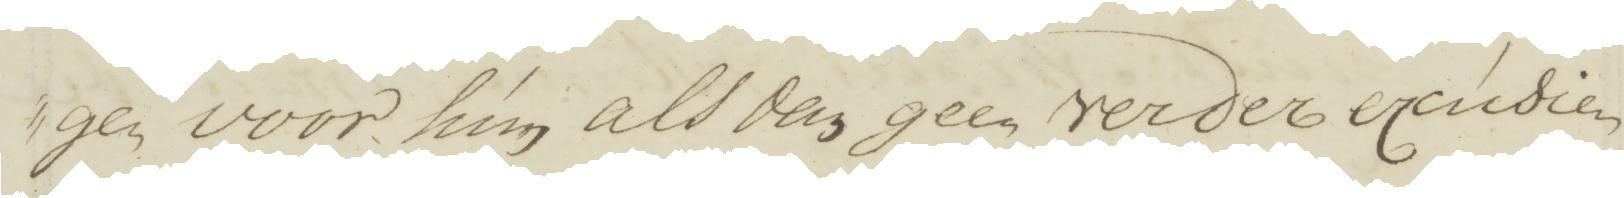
„gen voor hun als dan geen verder excusien
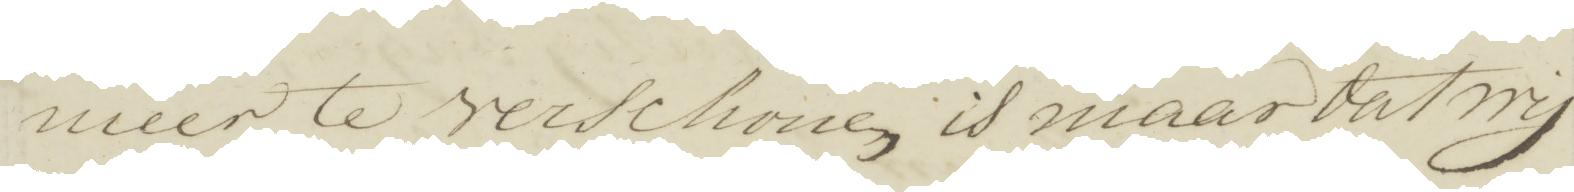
meer te verschonen is maar dat wij
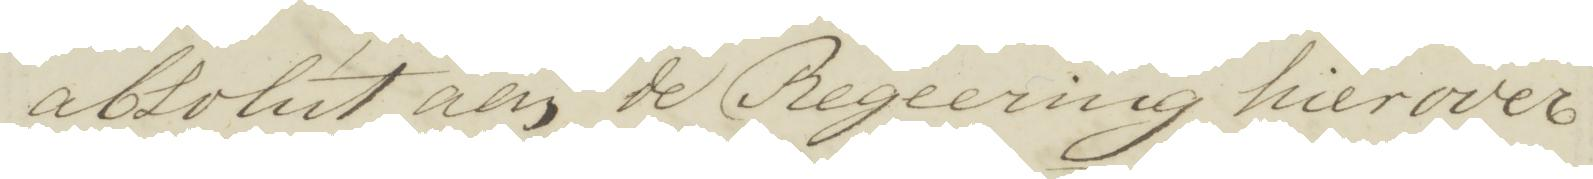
absolut aan de Regeering hier over
